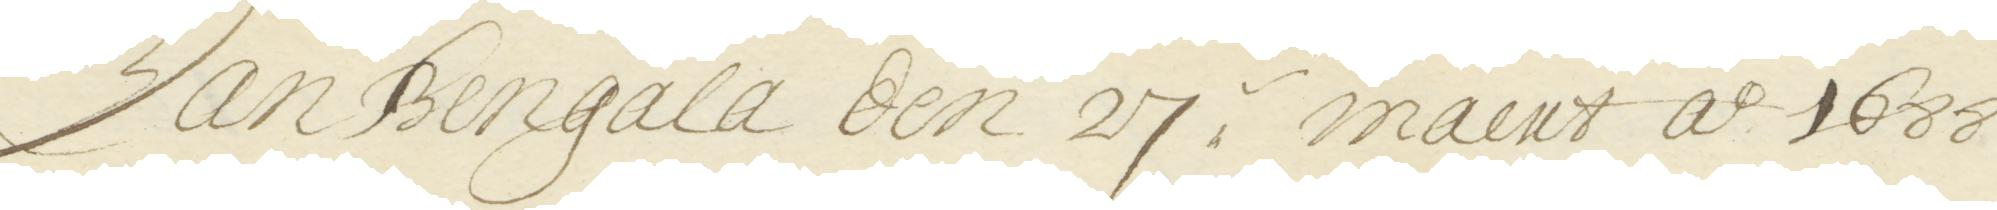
Van Bengala den 27:' maert a:o 1688
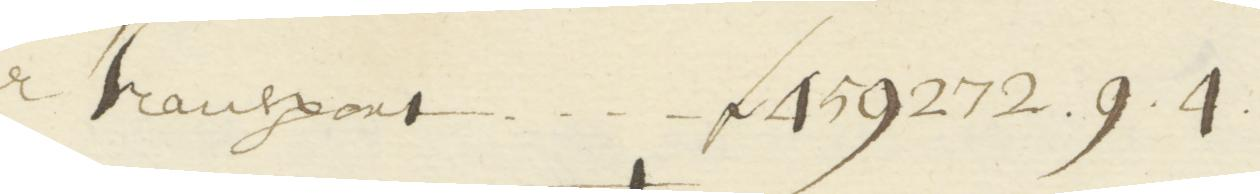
r transport - - - - ƒ459272.9.4
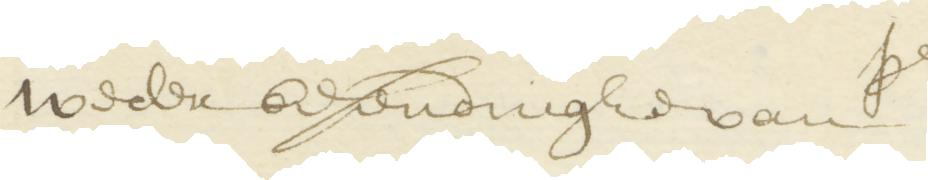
weder besendinghe van p
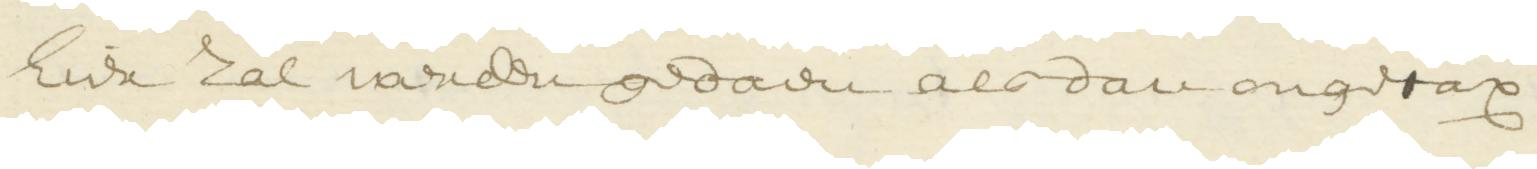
hier zal werden gedaen als dan ongetax
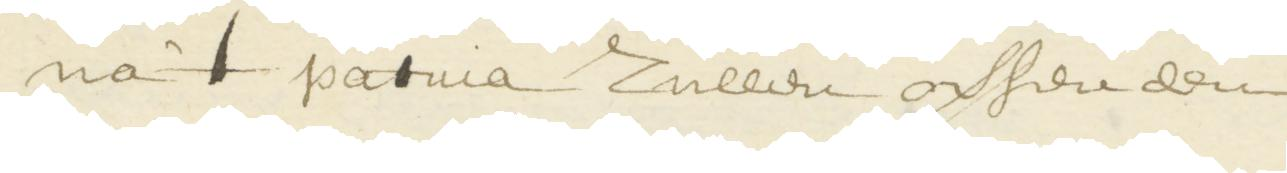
na 't patria zullen oversenden
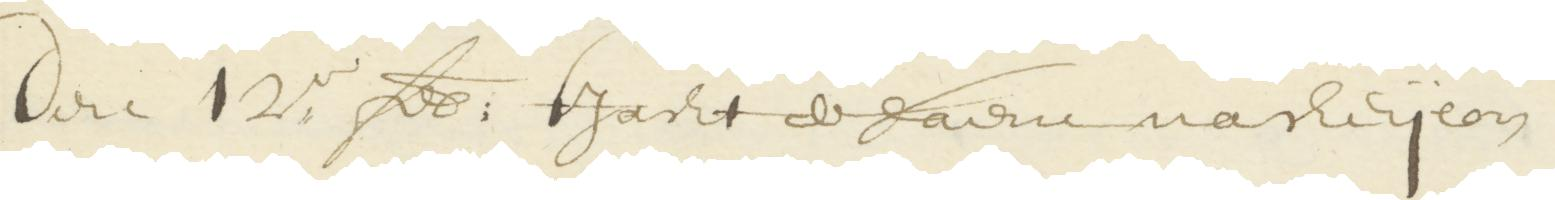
Den 12„' feb: tJacht de faem na cheijlon
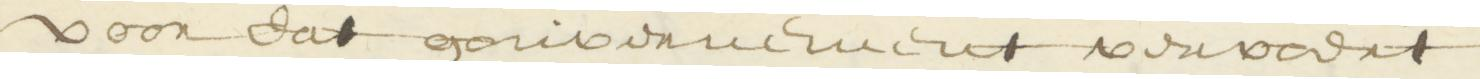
voor dat gouvernement vervoert
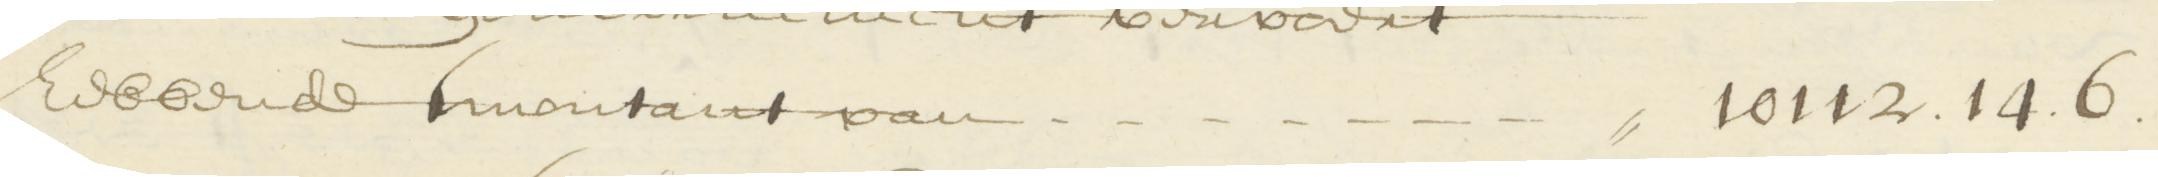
hebbende tmontant van - - - - - - - „ 10112.14.6.
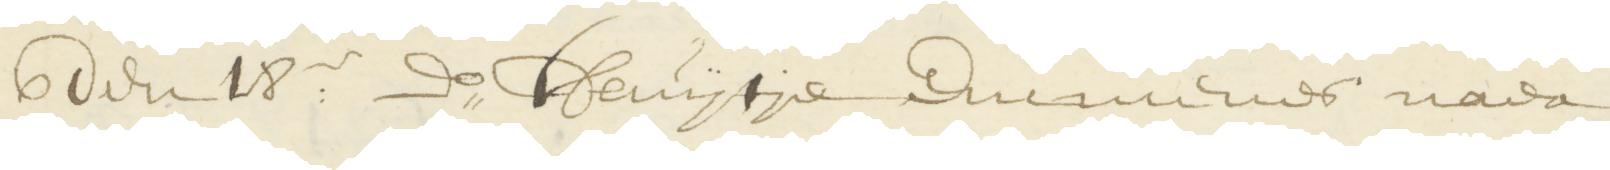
den 18:' _„o tfluijtje Emmenes naer
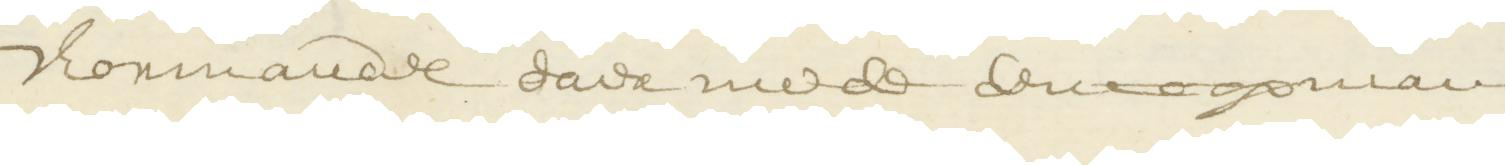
chormandel daer mede den coopman
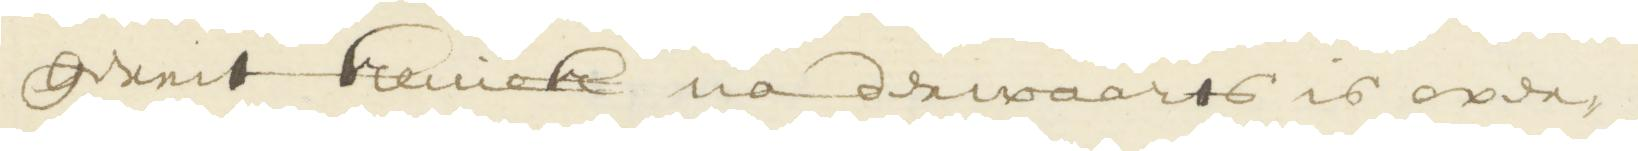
gerrit kenick na derwaarts is over„
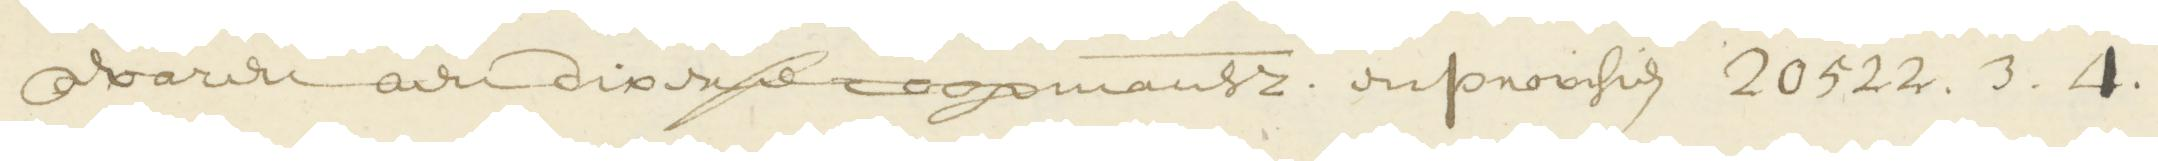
gevaren aen diverse coopmansz. en provisien 20522. 3. 4.
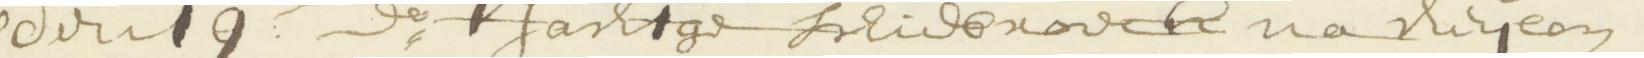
den 19:' _„o tJachtge schiebroeck na cheijlon
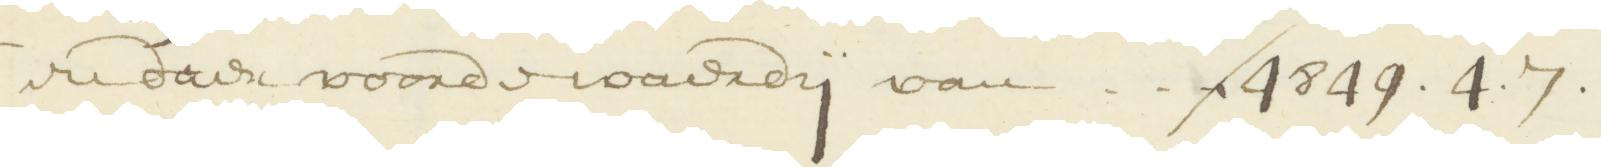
en daer voorde waerdij van - - ƒ4849. 4. 7.
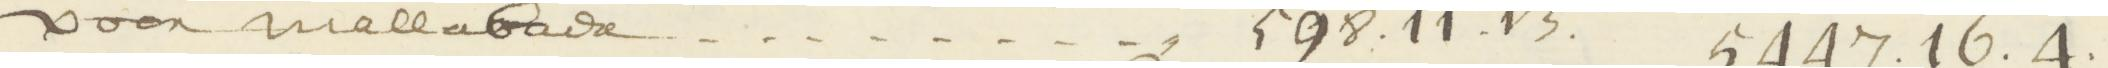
voor mallabaer - - - - - - - - „ 598.11.13. 5447.16.4.
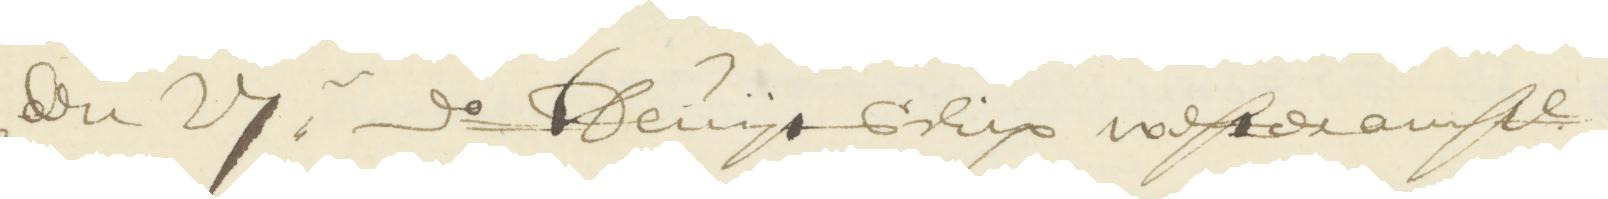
den 27„' _=o tfluijtschip westeramst=l
